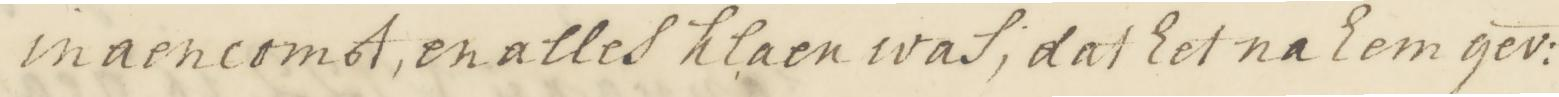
in aencomst, en alles klaer was, dat het na hem gev:
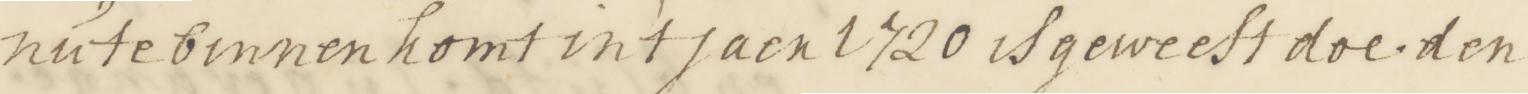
nu te binnenkomt in 't jaer 1720 is geweest doe den
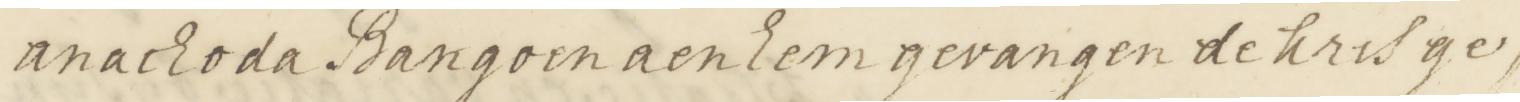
anachoda Bangoen aen hem gevangen de kris ge„
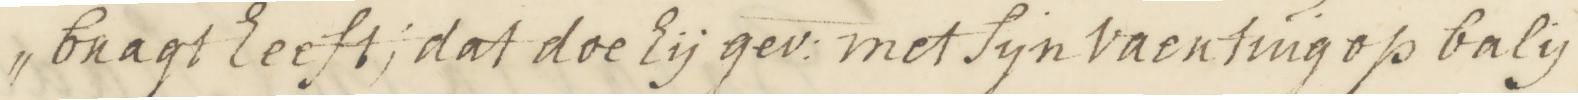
„bragt heeft; dat doe hij gev: met sijn vaertuig op balij
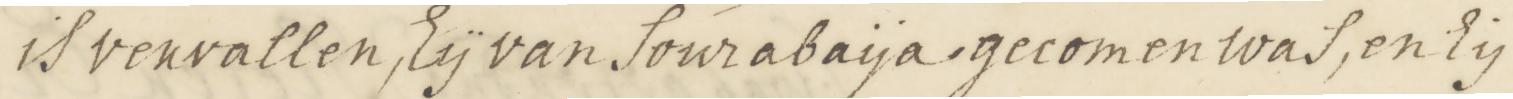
is vervallen, hij van Sourabaija gecomen was, en hij
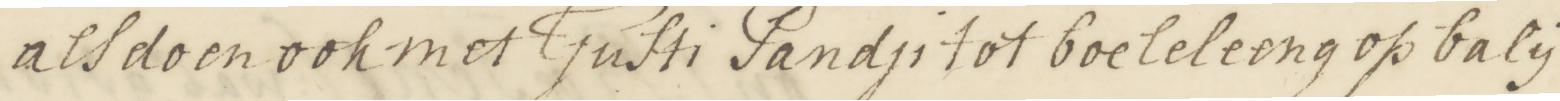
als doen ook met Gusti Pandji tot boeleleeng op balij
